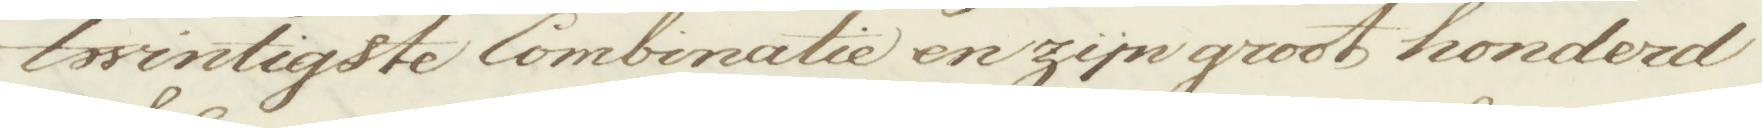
twintigste Combinatie en zijn groot honderd
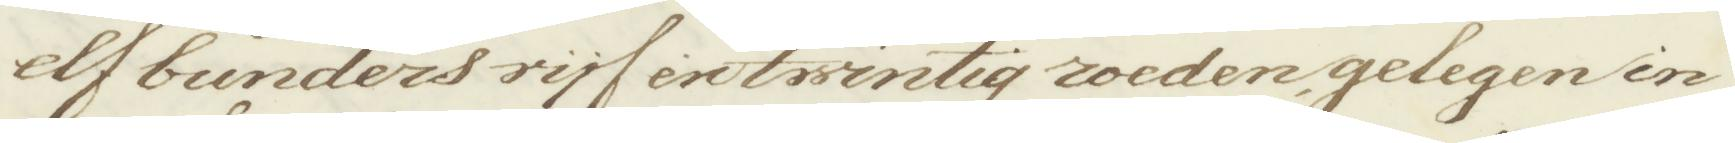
elf bunders vijf en twintig roeden, gelegen in
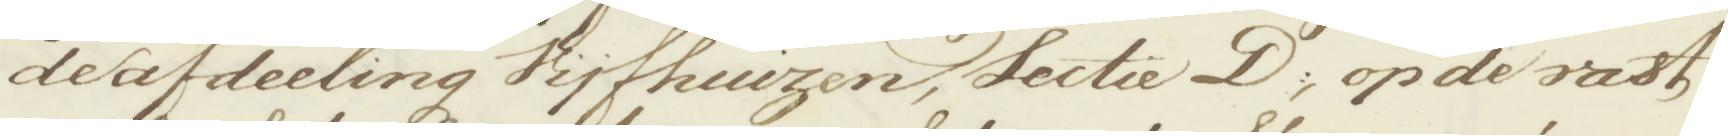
de afdeeling Vijfhuizen, sectie D:, op de vast.
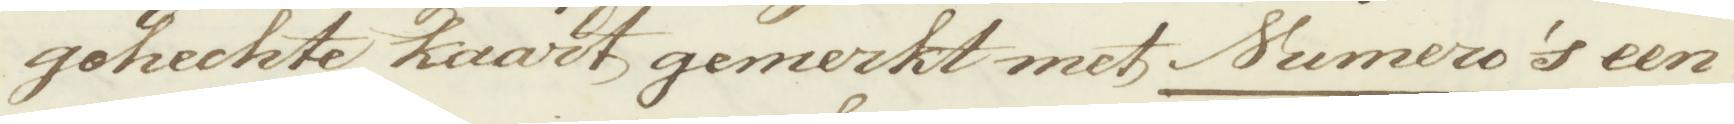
gehechte kaart gemerkt met Numero 's een
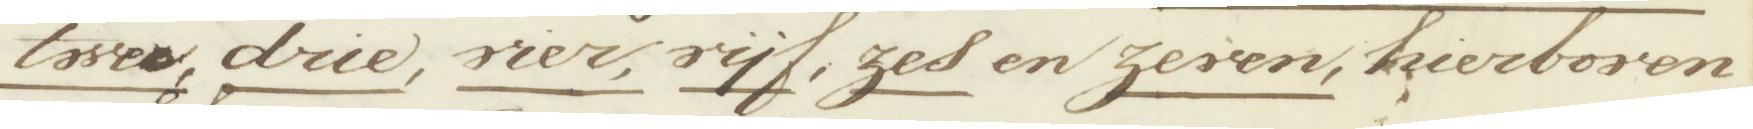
twee, drie, vier, vijf, zes en zeven, hierboven
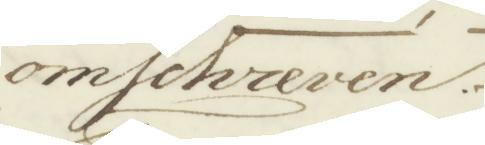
omschreven.
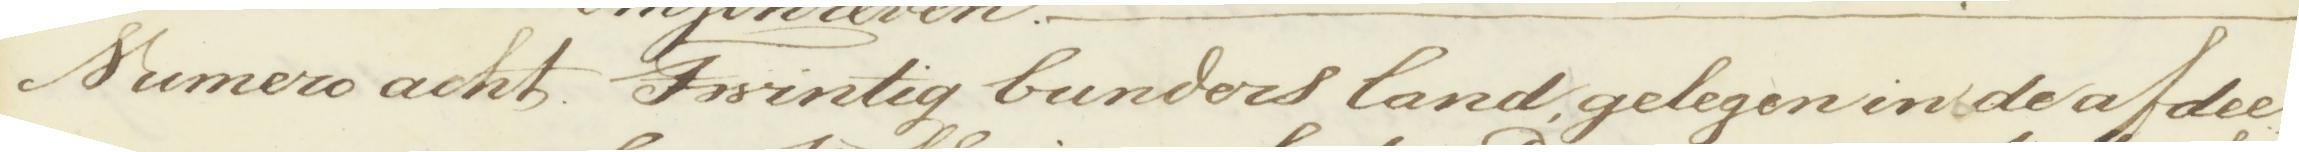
Numero acht. Twintig bunders land, gelegen in de afdee„
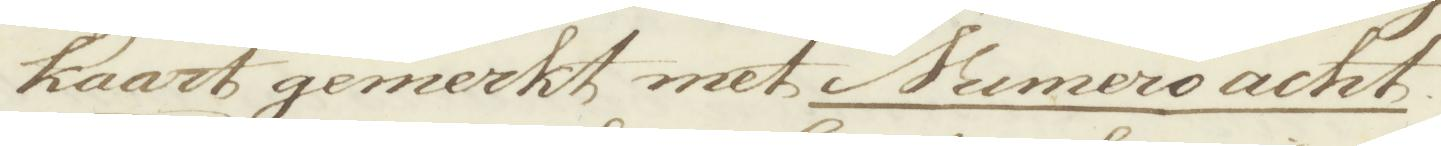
kaart gemerkt met Numero acht
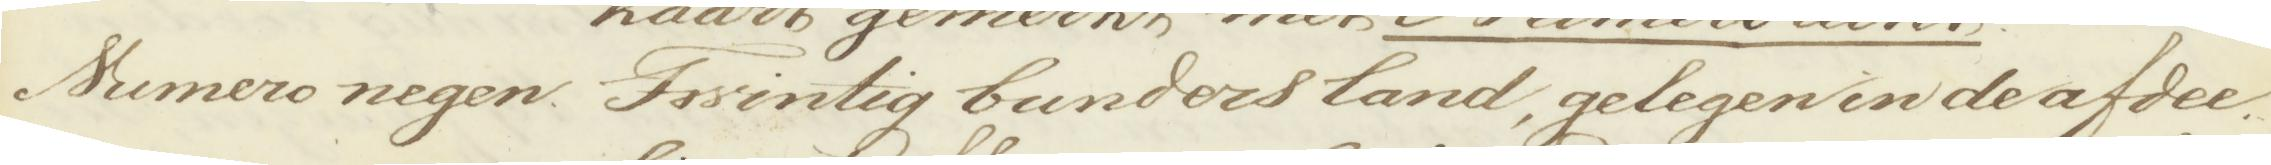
Numero negen. Twintig bunders land, gelegen in de afdee„
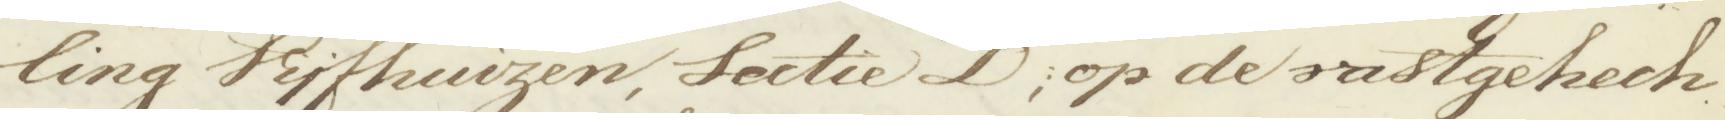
ling Vijfhuizen, Sectie D,: op de vastgehech.
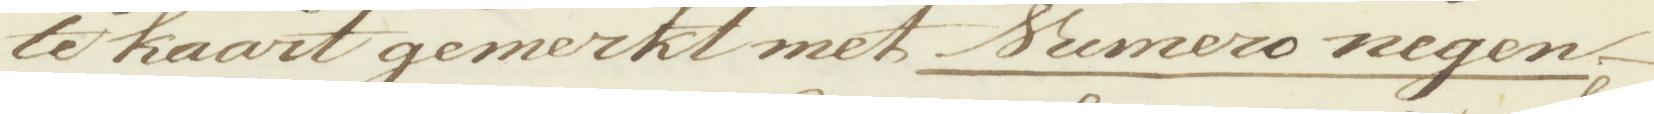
te kaart gemerkt met Numero negen. —
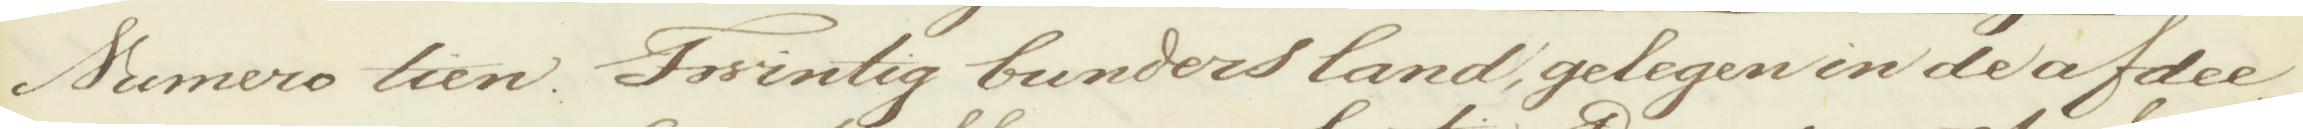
Numero tien. Twintig bunders land, gelegen in de afdee
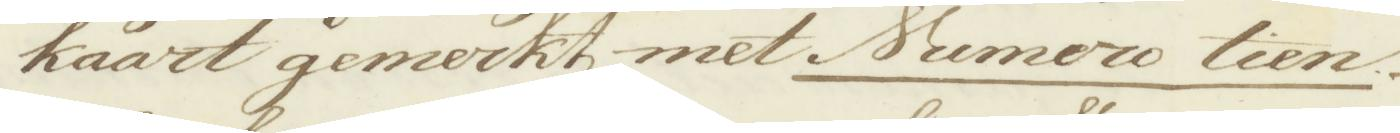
kaart gemerkt met Numero tien.
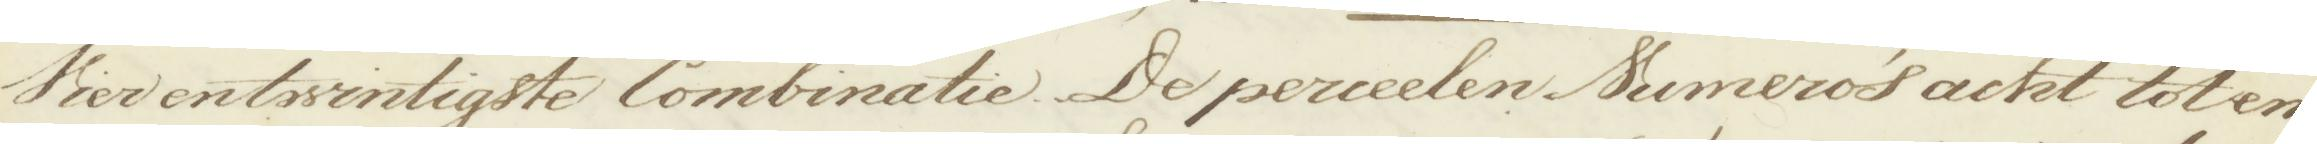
Vier en twintigste Combinatie.. De perceelen Numero's acht tot en
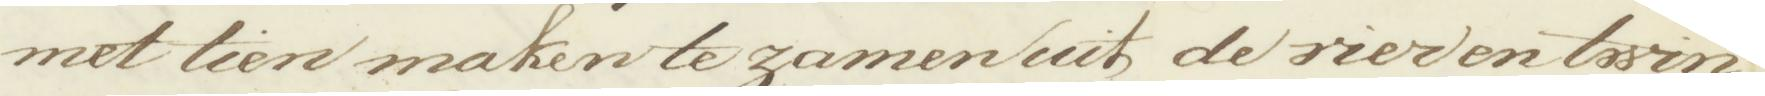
met tien maken te zamen uit de vier en twin
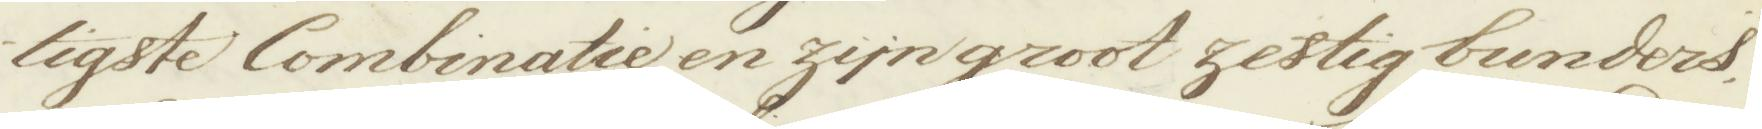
tigste Combinatie en zijn groot zestig bunders,
